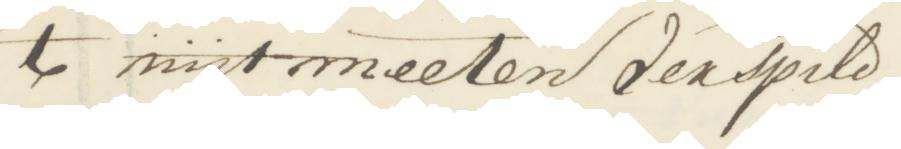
t uijt meeten verspild
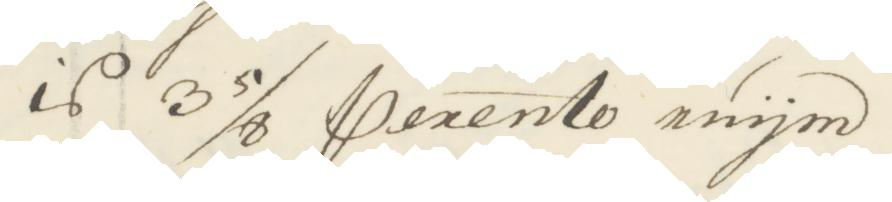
is 3 5/8 perento ruijm
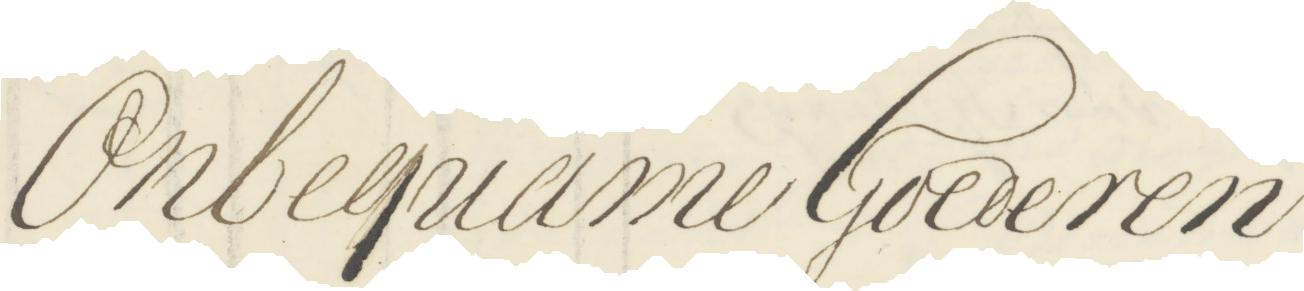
Onbequame Goederen
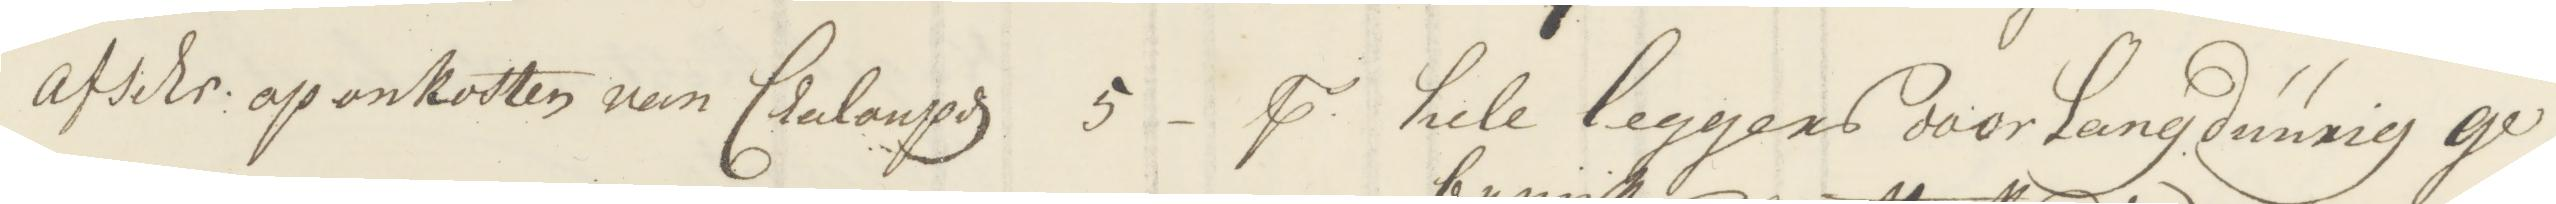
afschr: op onkosten van Chaloupen 5 — p.s hele leggers door lang duurig ge
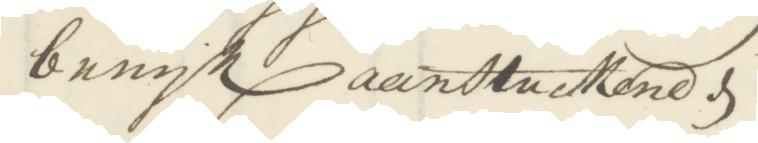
bruijk aanstuckend en
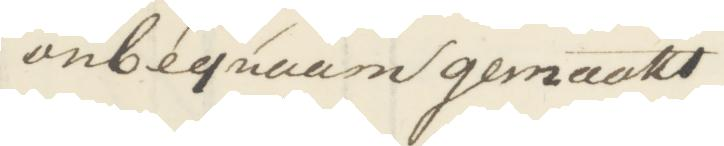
onbequaam gemaakt
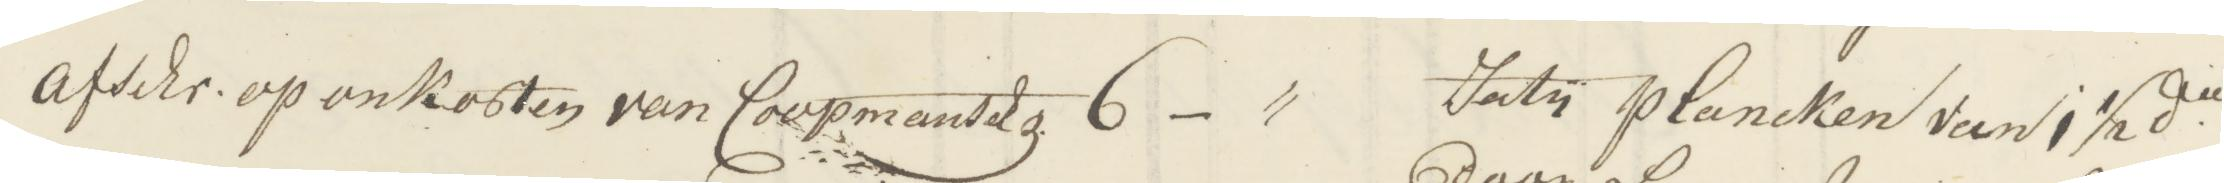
afschr: op onkosten van Coopmanschz. 6 — „ Iatij plancken van 1½ d:m
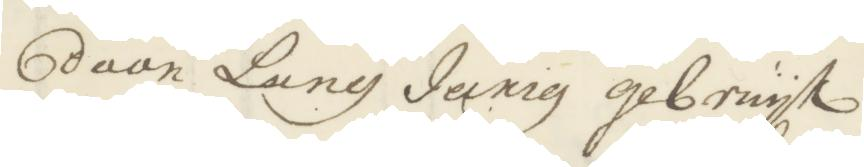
door Lang Iarig gebruijk
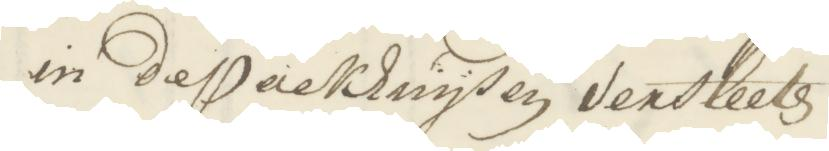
in de packhuijsen versleeten
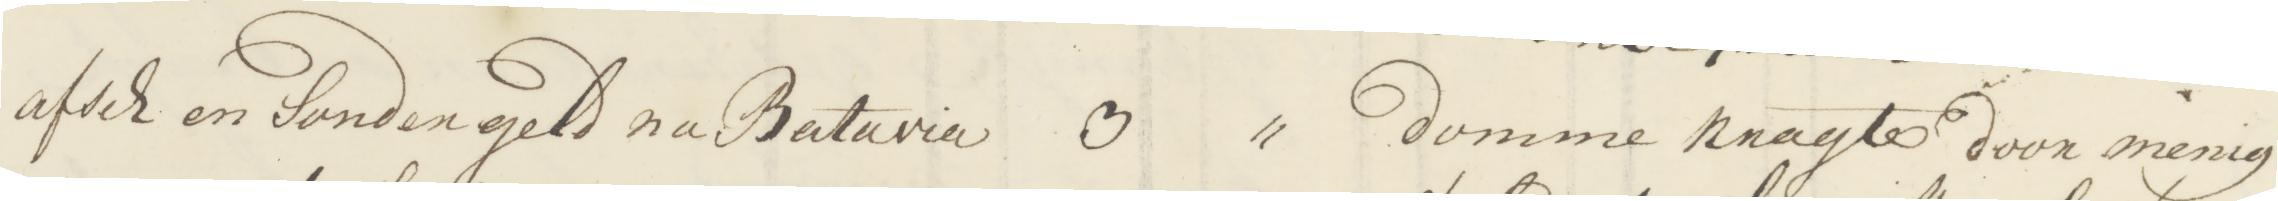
afsch: en sonder geld na Batavia 3 „ domme kragte door menig
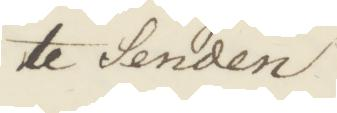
te senden
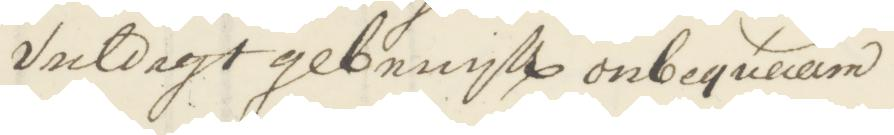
vuldigt gebruijk onbequaam
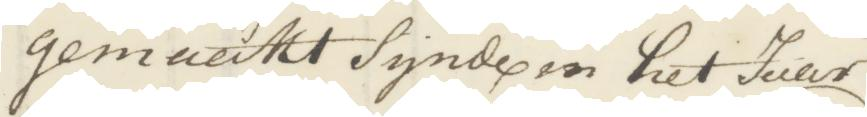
gemaakt sijnde in het Iaar
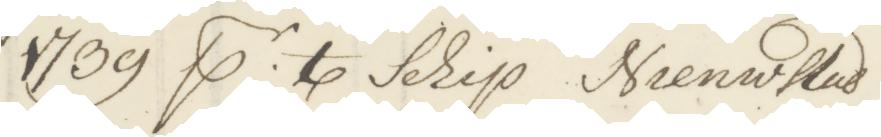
1739 p.r t schip Nieuwstad
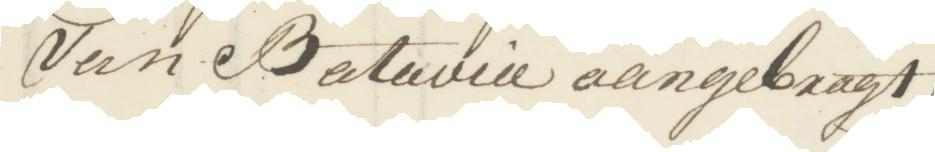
van Batavia aangebragt
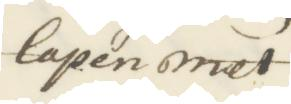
lopen met
